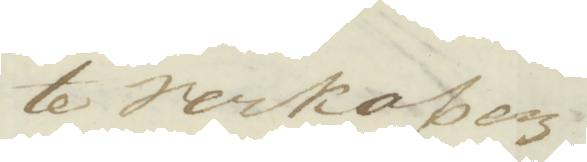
te verkopen
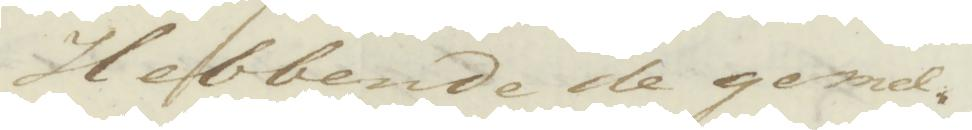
Hebbende de gemel„
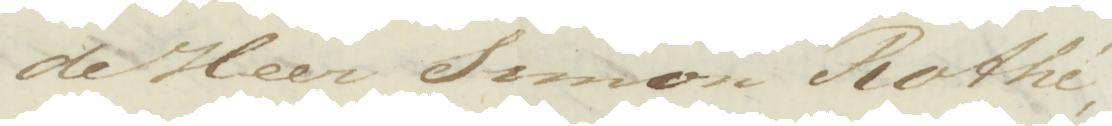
de Heer Simon Rothé,
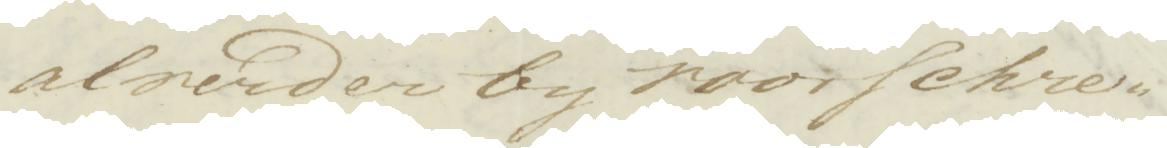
alverder bij voorschre„
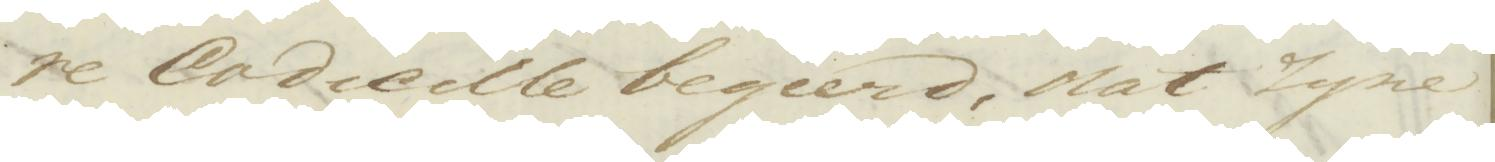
ve Codicille begeerd, dat Zyne
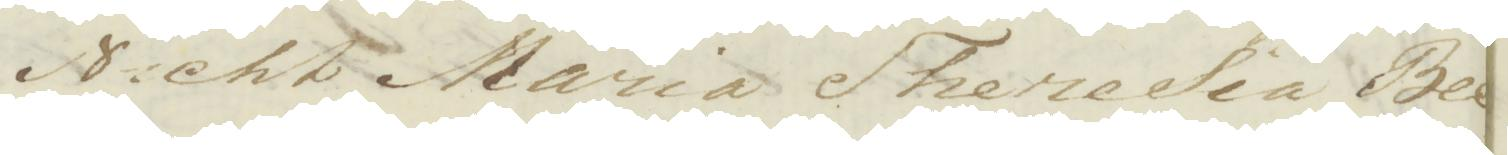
Nicht Maria Theresia Bee
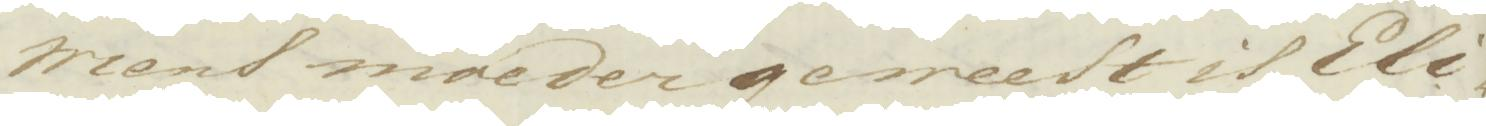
wiens moeder geweest is Eli„
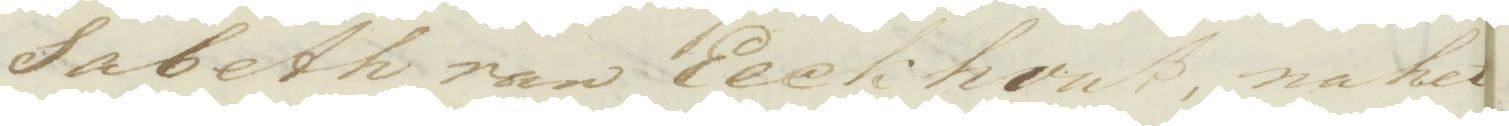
sabeth van Eeckhout, na het
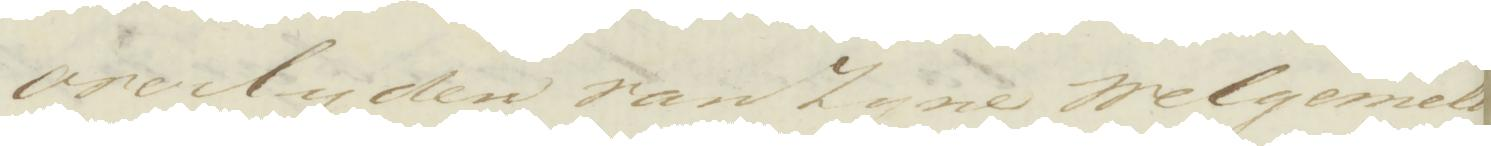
overlijden van Zyne welgemeld
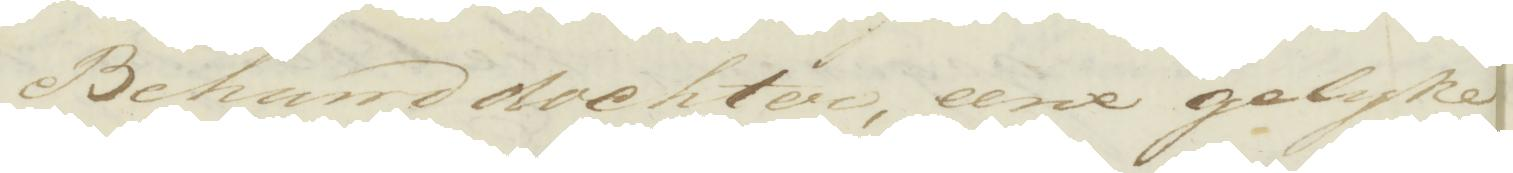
Behuwddochter, eene gelijke
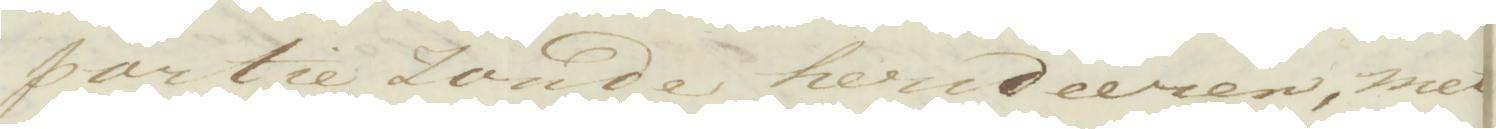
portie zoude herideeren, met
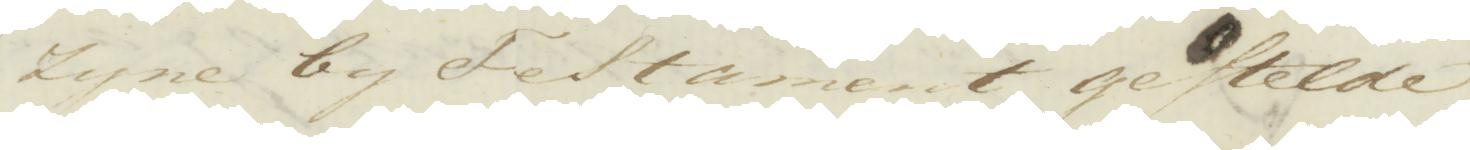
zyne bij Testament gestelde
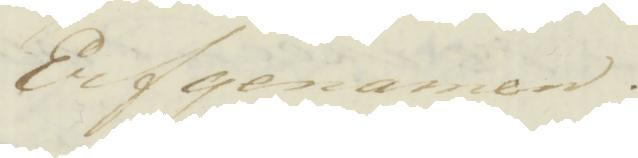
Erfgenamen.
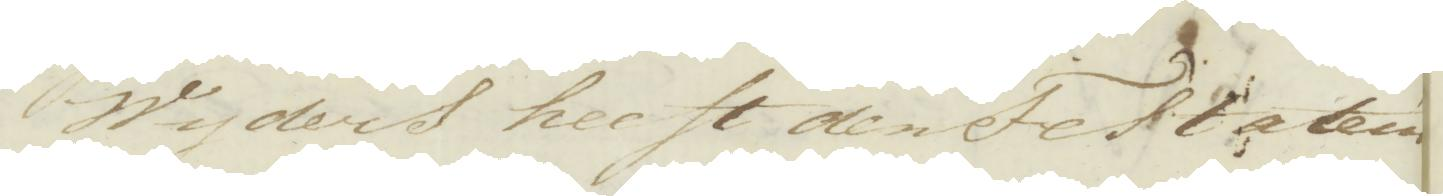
Wijders heeft den Testateur
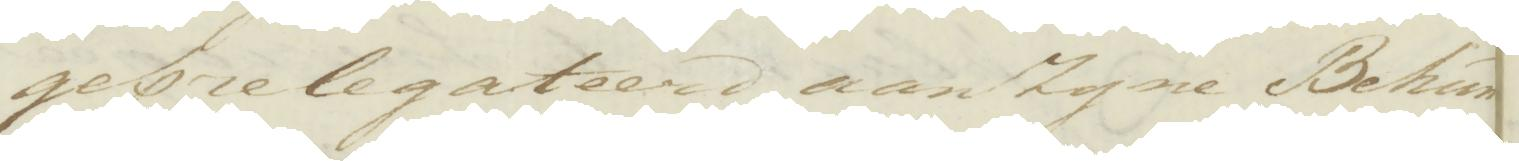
geprelegateerd aan Zyne Behuw
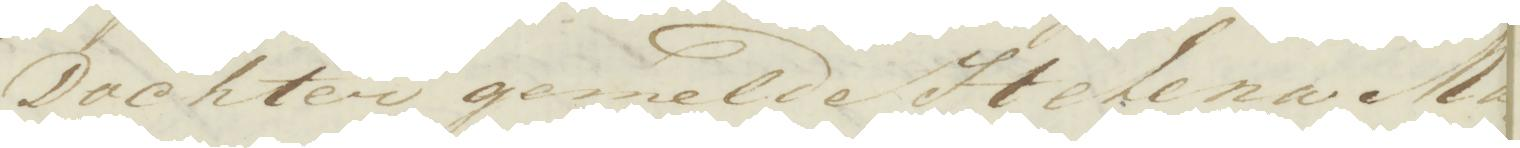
Dochter gemelde Helena Ma
